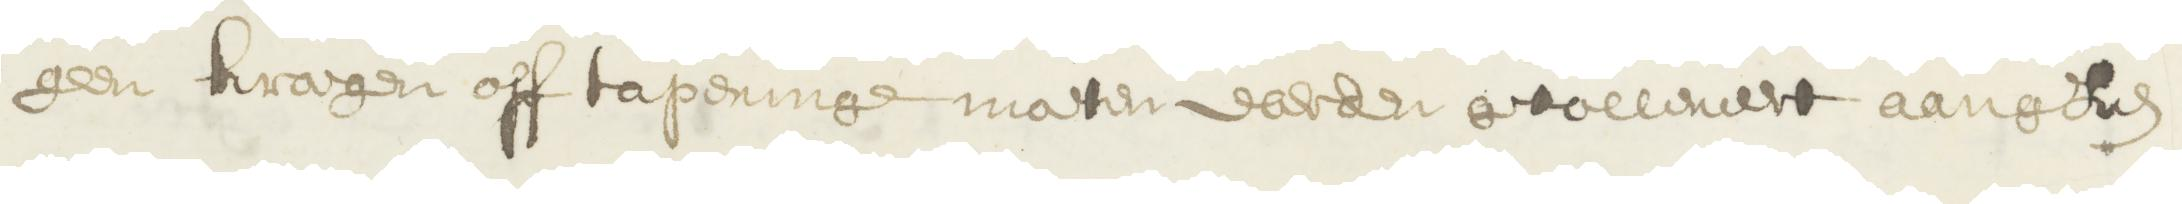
geen kroegen off taperinge moeten werden getollereert aangesien
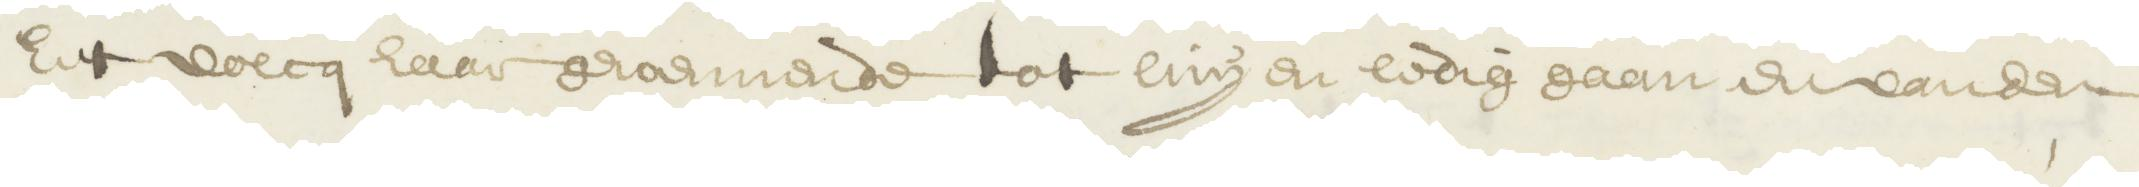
het volcq haar gewennende tot luij en ledig gaan en van den
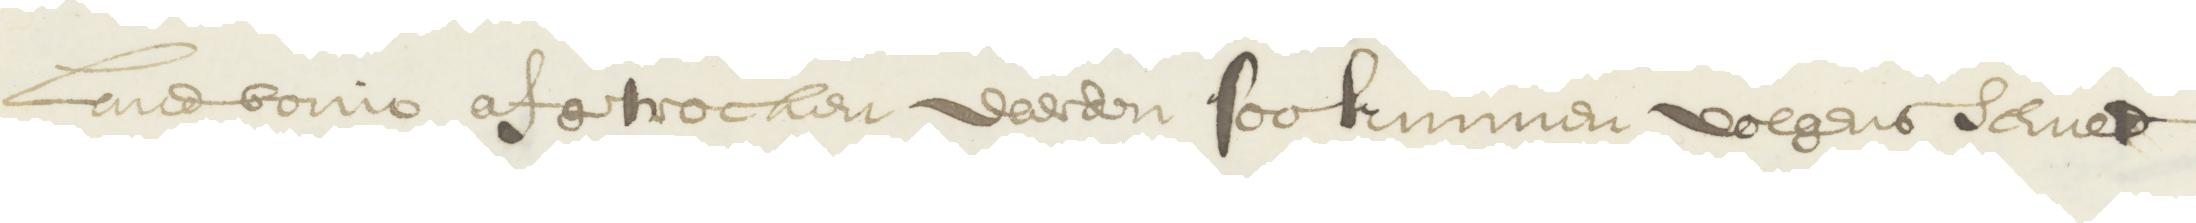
Landbonio afgetrocken werden soo kunnen volgens schuld
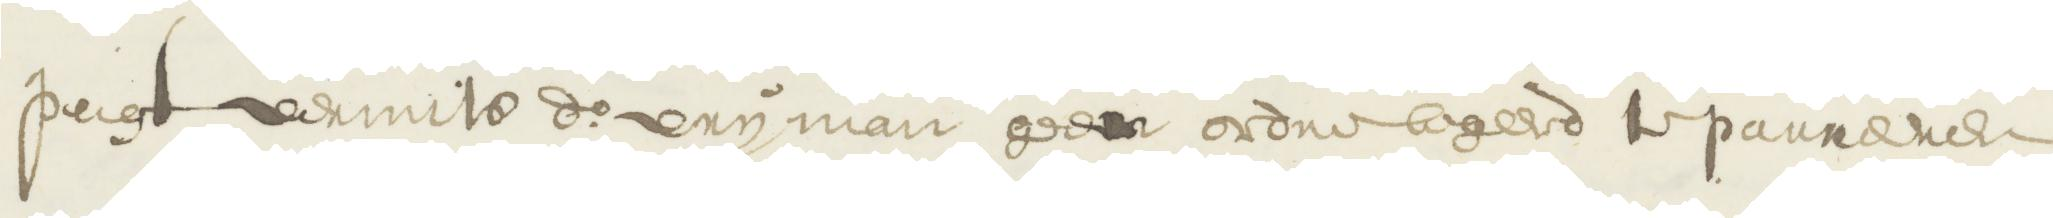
pligt vermits d.o vrijman geen ordre begeerd te parreren
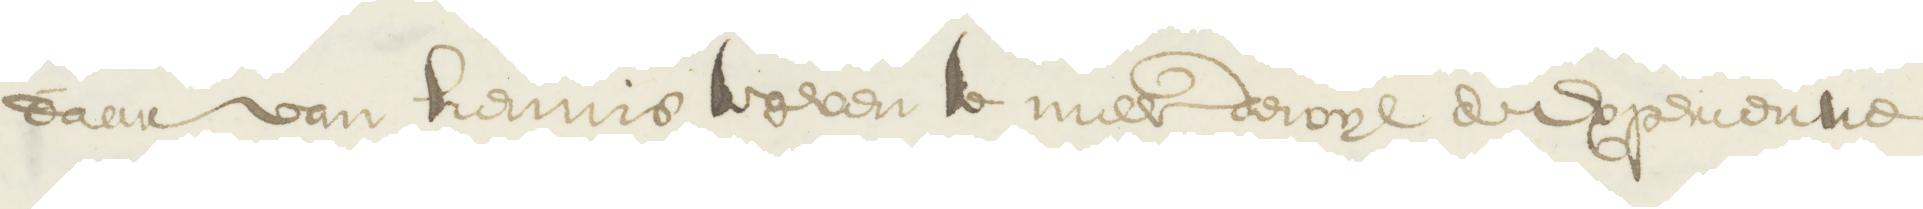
daar van kennis tegeven te meer dewijl de Experientie
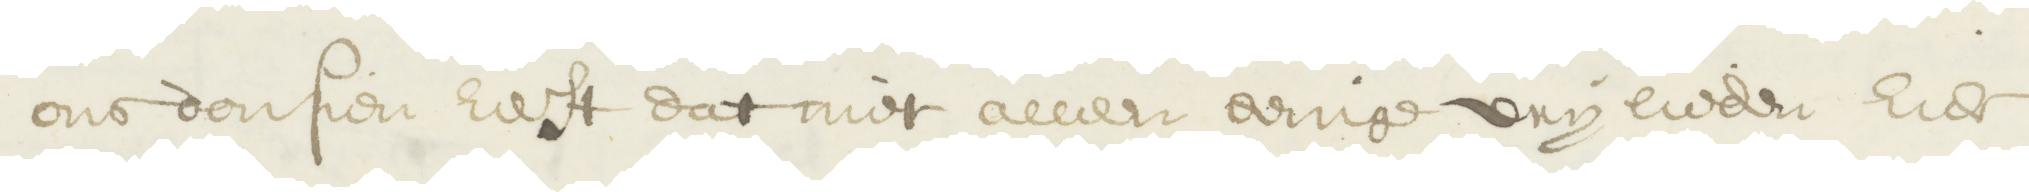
ons den sien heeft dat niet alleen eenige vrij lieden hier
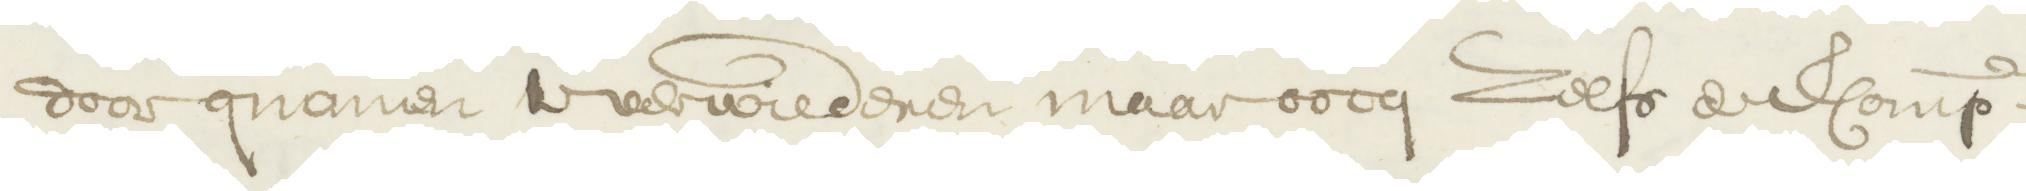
door quamen te verwiederen maar oocq zelfs de EComp
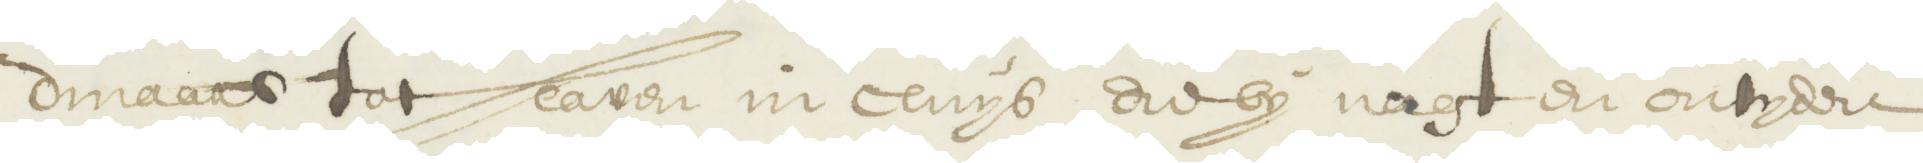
dinaars tot slaven in cluijs die bij nagt en ontijden
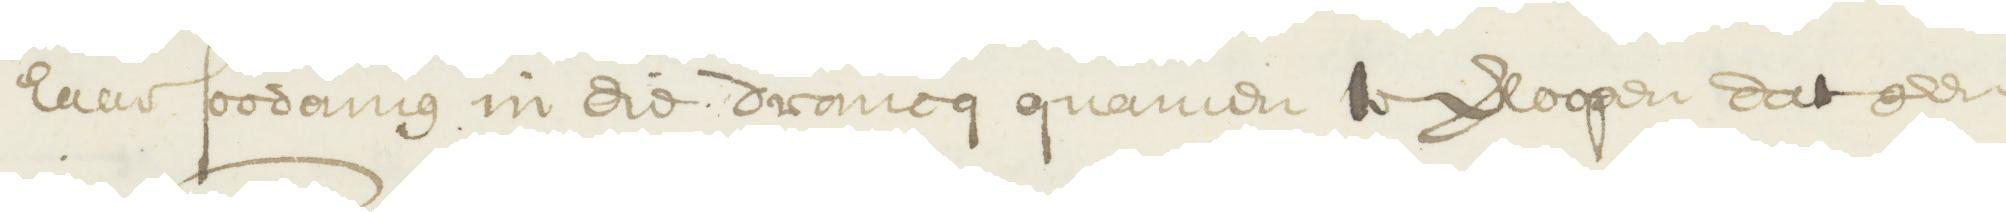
haar soodanig in die drancq quamen te verloopen dat geen
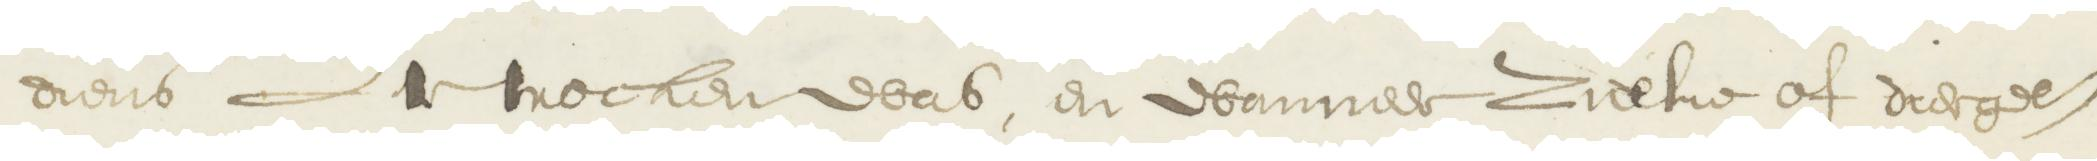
dienst te trocken was, en wanneer Zieke of diergelijk
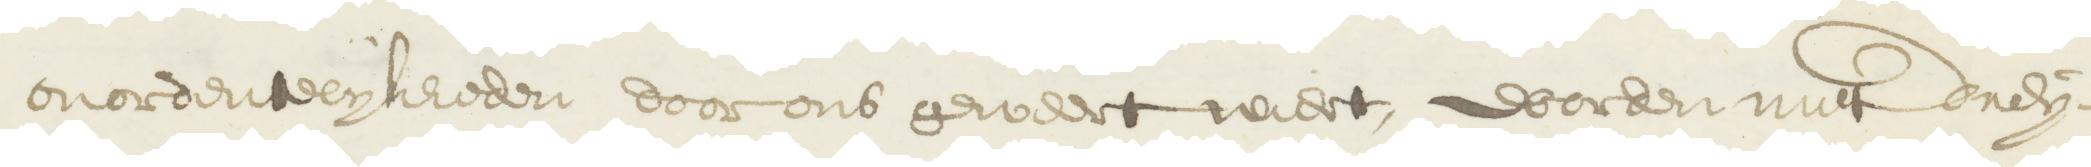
onordentelijkheden door ons geweert wiert, worden met dreij
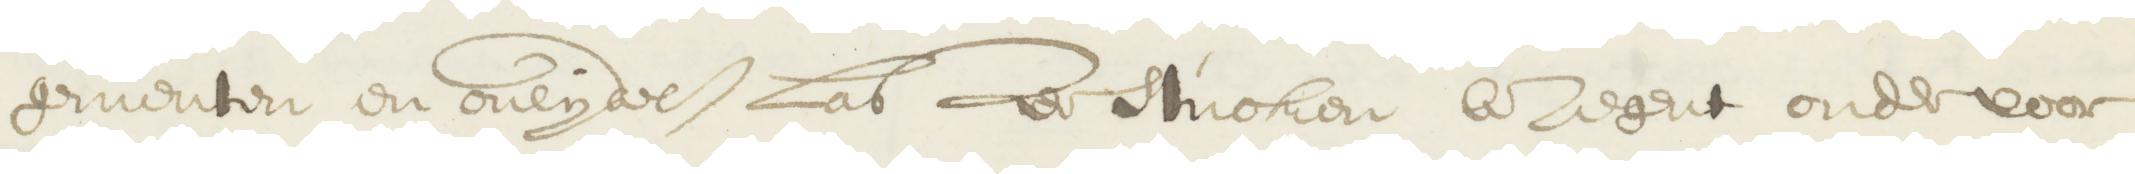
gementen en onlijdelijk laster stucken bejegent onder voor
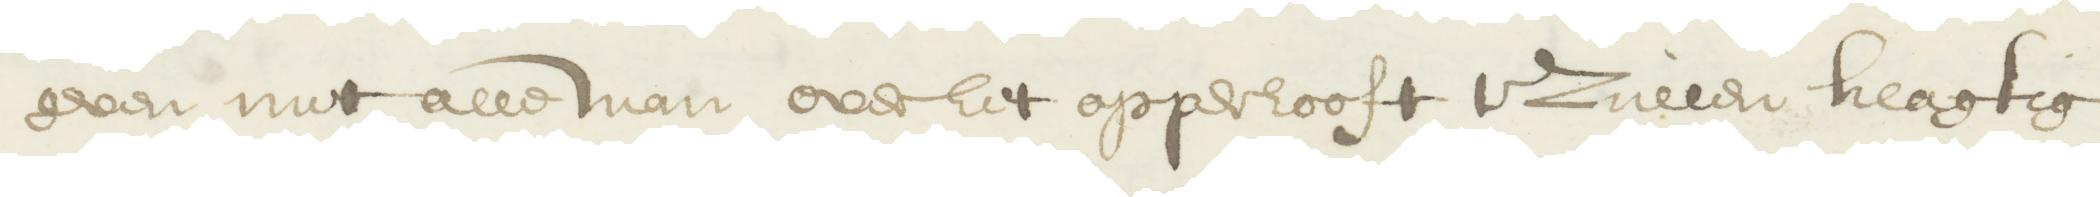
geven met alle man over het opperhooft te zullen klagtig
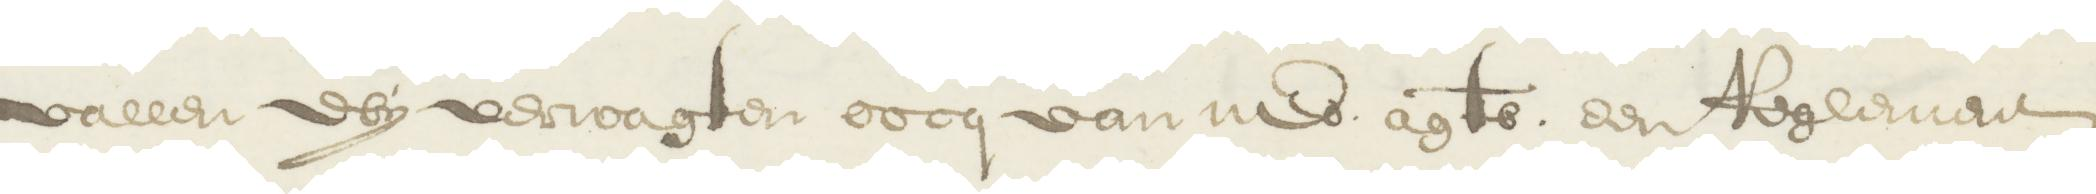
vallen wij verwagten oocq van u Ed. agtb. den Reglement
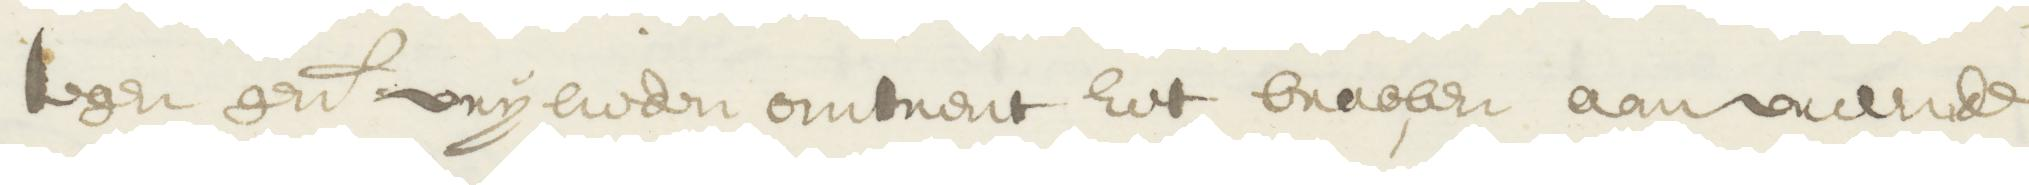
tegen gen.e vrij lieden omtrent het brabben aan vreemde
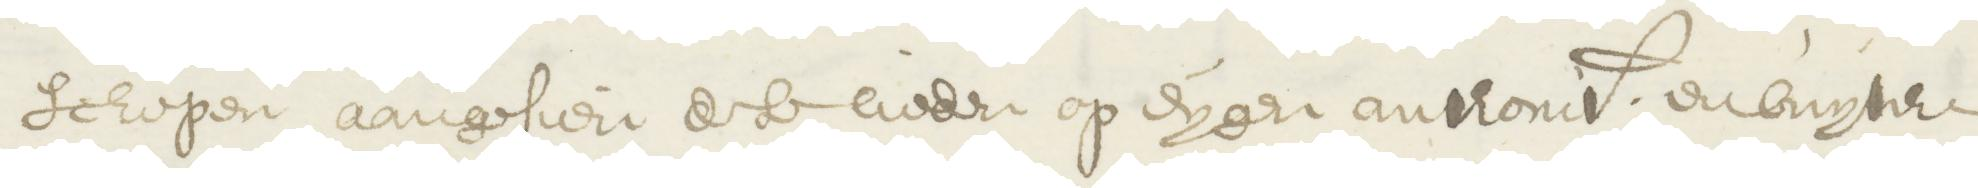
schepen aangesien dese lieden op eijgen authorit. en buijten
